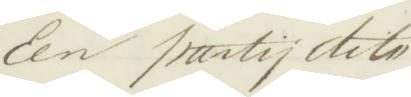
Een partij dito
